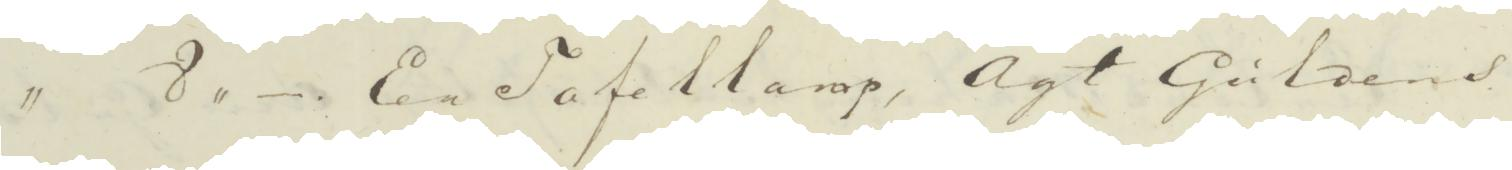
„ 8„ —. Een Tafellamp, Agt Guldens
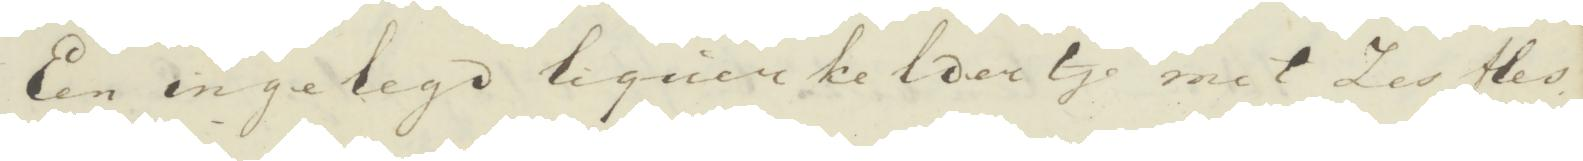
Een ingelegd liquerkeldertje met Zes fles.
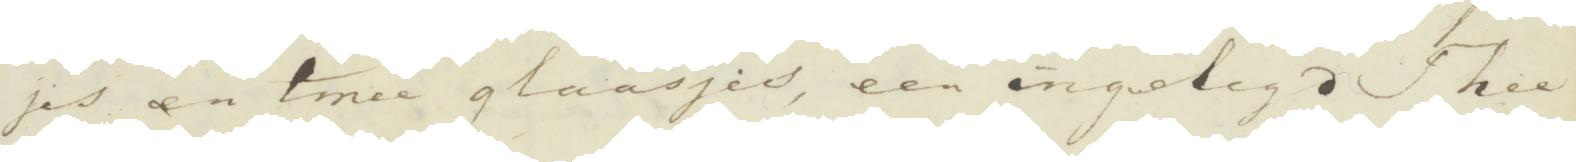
jes en twee glaasjes, een ingelegd Thee
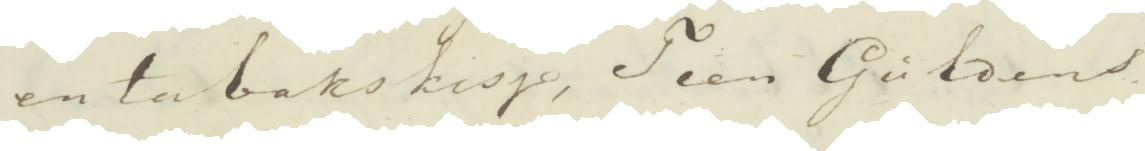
en tabakskisje, Tien Guldens
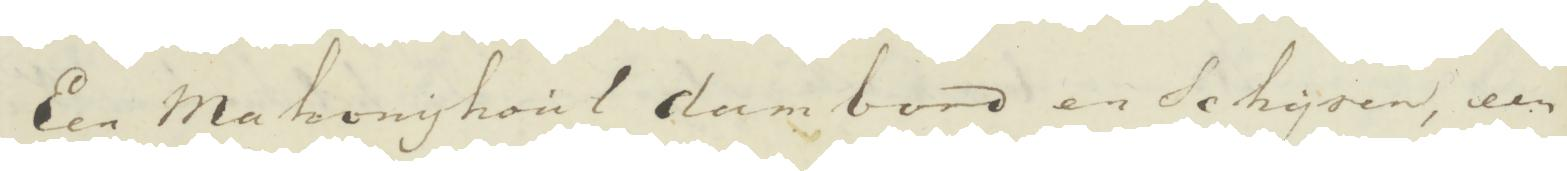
Een Mahonijhout dambord en schijven, een
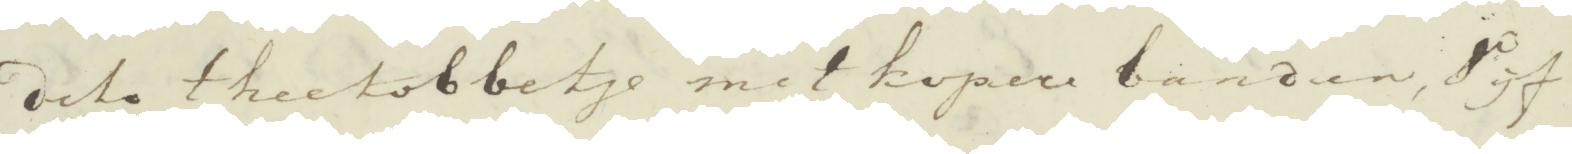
dito theetobbetje met kopere banden, Vijf
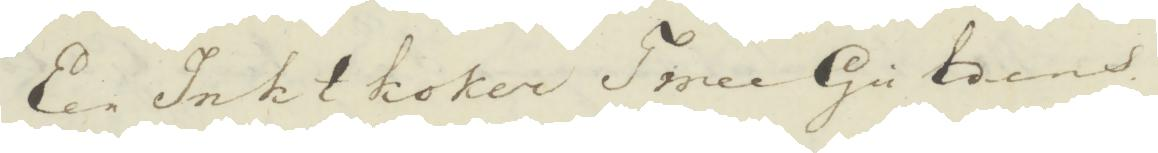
Een Inkt koker Twee Guldens
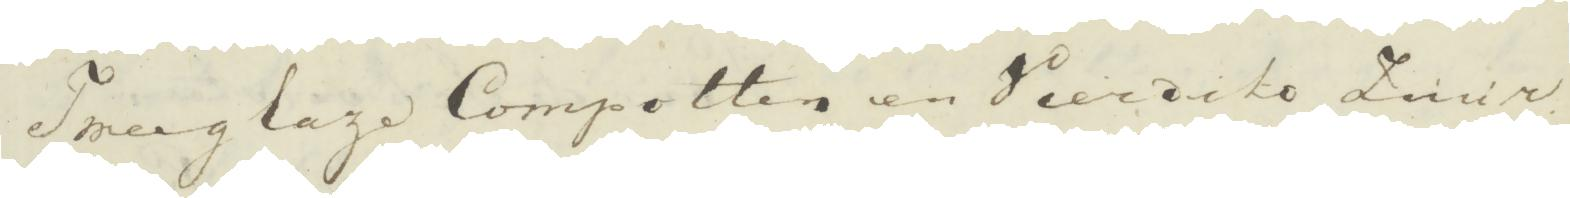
Twee glaze Compotten en Vier dito Zuur
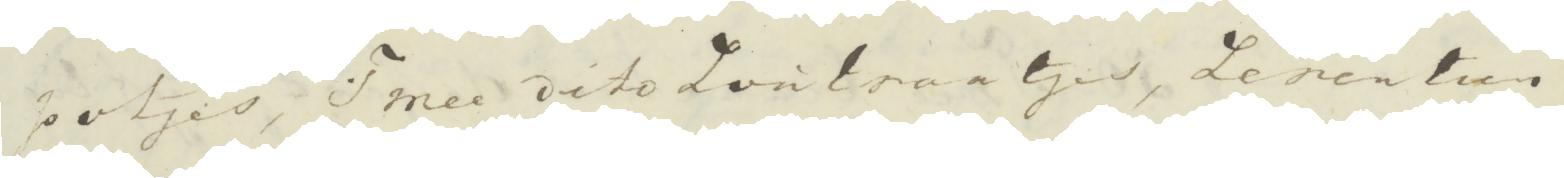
potjes, Twee dito Zoutvaatjes, Zeventien
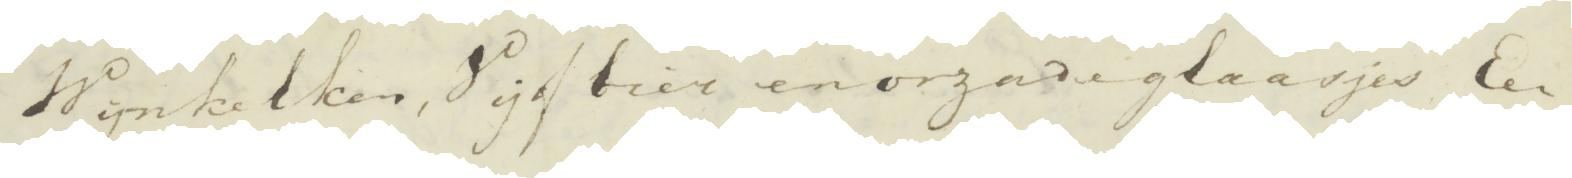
Wijnkelken, Vijf bier en orzade glaasjes Een
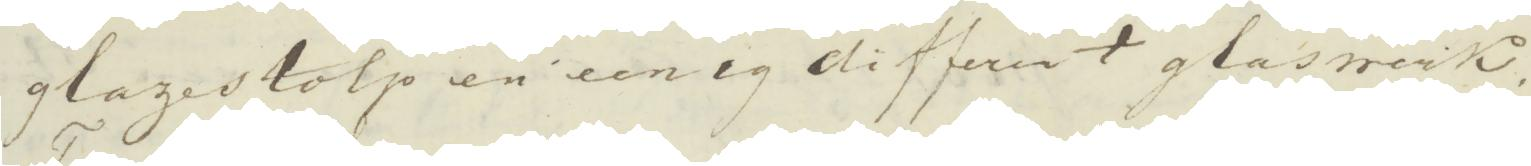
glazestolp en eenig different glaswerk
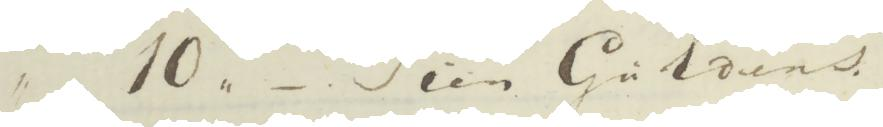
„ 10„ —. Tien Guldens.
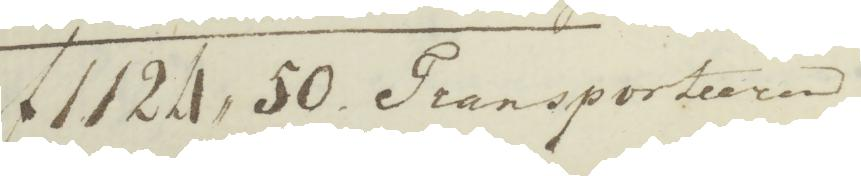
ƒ 1124„ 50. Transporteeren
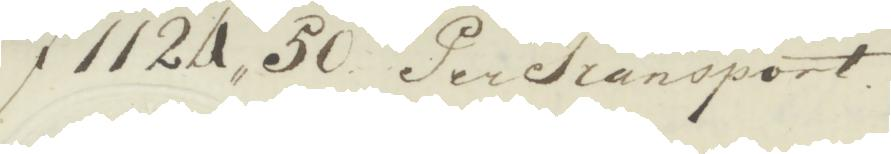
ƒ 1124„ 50. Per Transport.
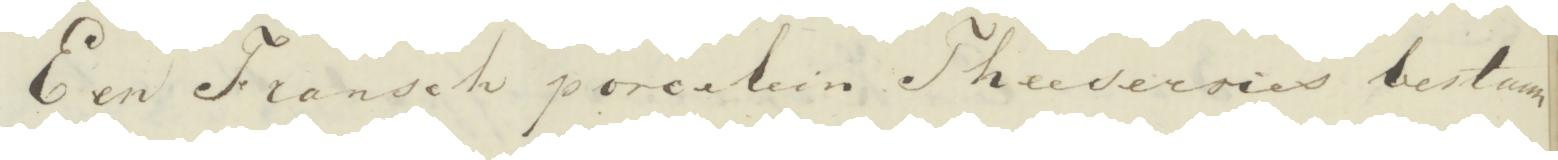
Een Fransch porcelein Theeservies bestaan
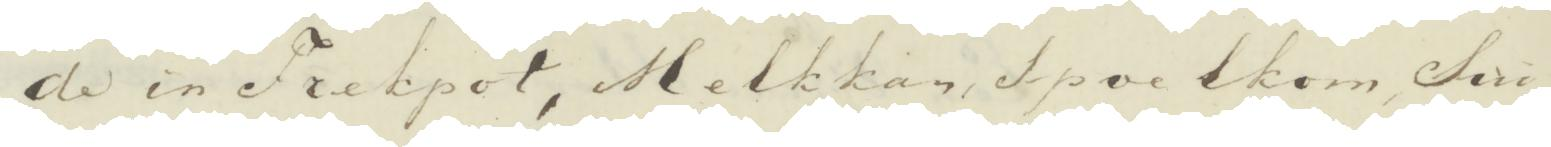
de in Trekpot, Melkkan, Spoelkom, Sui
